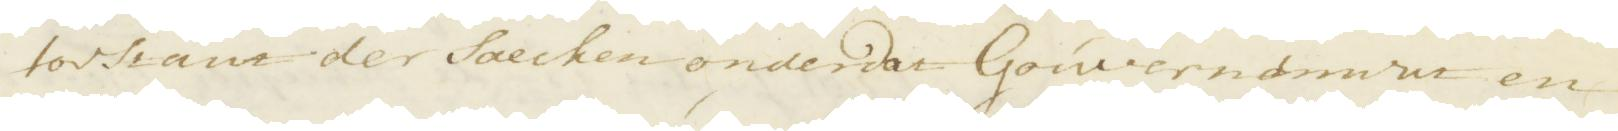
toestant der saecken onder dat Gouvernement en
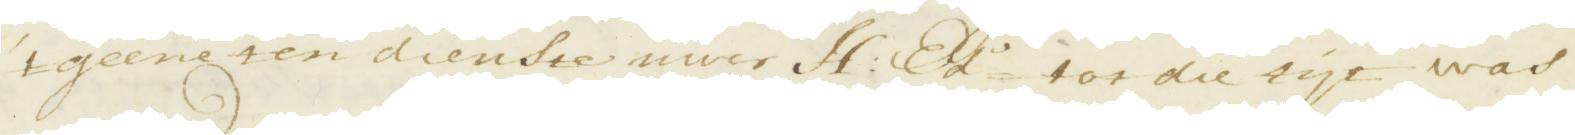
't geene ten dienste uwer H: Ed=e tot die tijt was
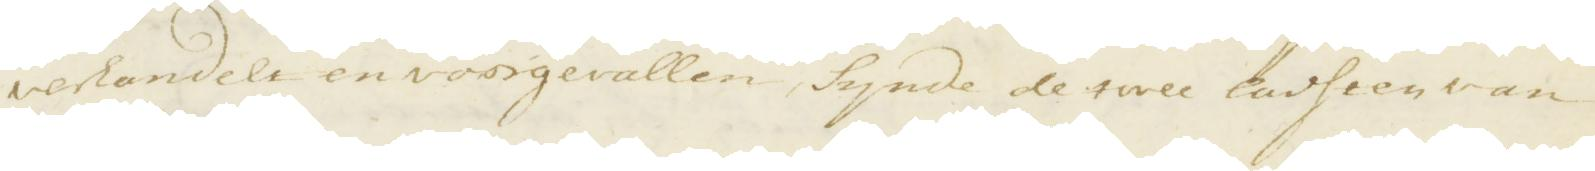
verhandelt en voorgevallen, sijnde de twee laesten van
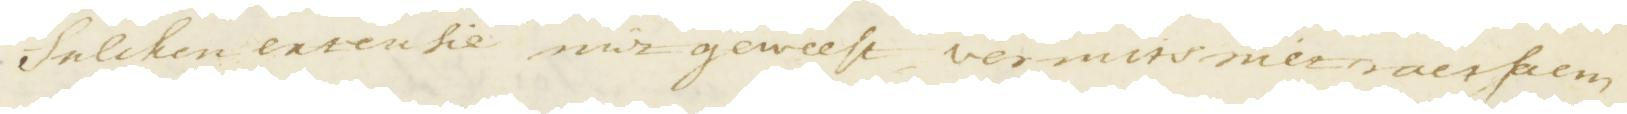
sulcken extensie niet geweest vermits niet raetsaem
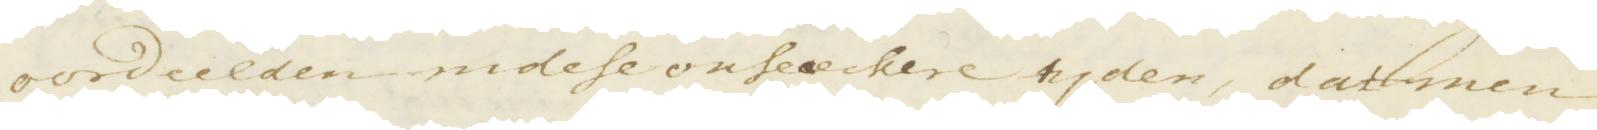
oordeelden in dese onseeckere tijden, dat men
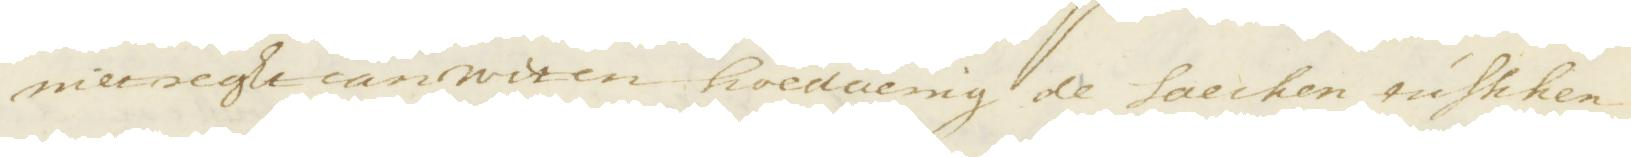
niet reght can weten hoedaenig de saecken tusschen
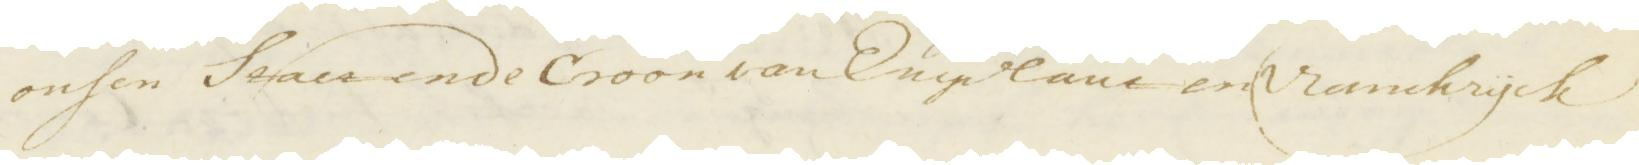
onsen Staet ende Croon van Engelant en Vrankrijck
